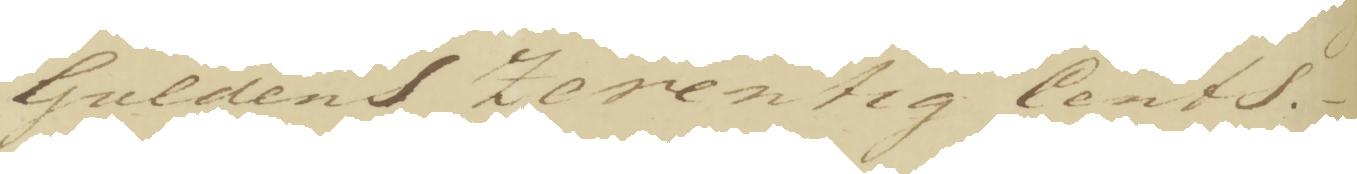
Guldens Zeventig Cents.
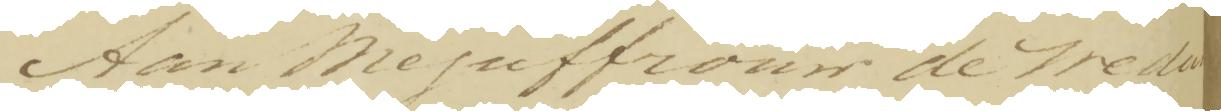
Aan Mejuffrouw de Wedu
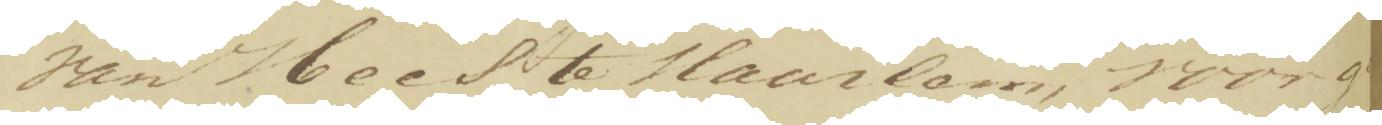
van Hees, te Haarlem, voor g
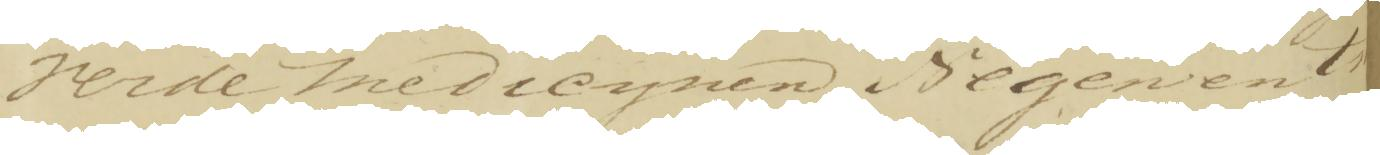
verde medicynen Negen en t
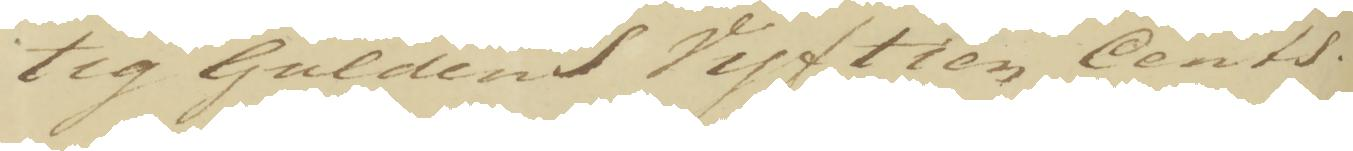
tig Guldens Vijftien Cents.
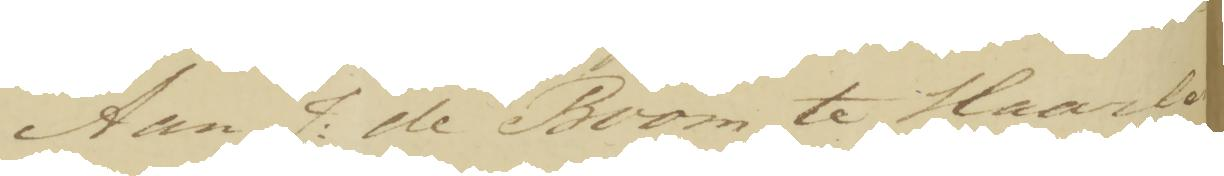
Aan J: de Boom, te Haarle
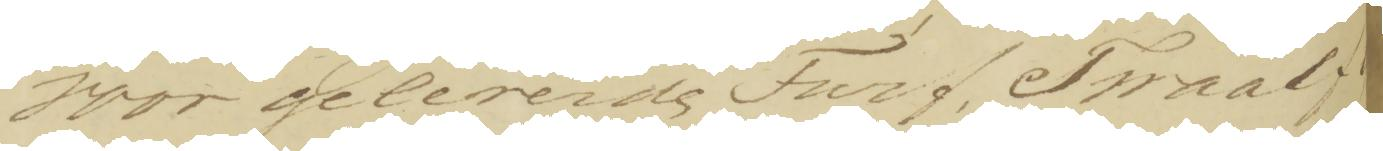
voor geleverde Turf, Twaalf
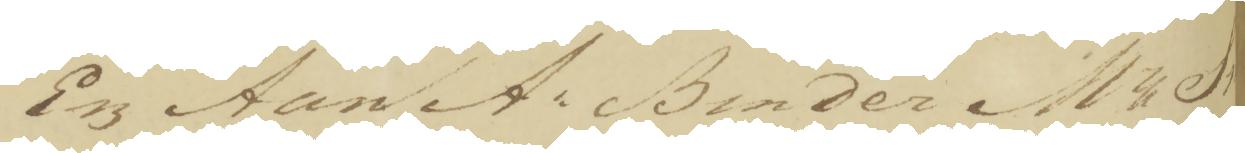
En Aan A: Binder Mrk S
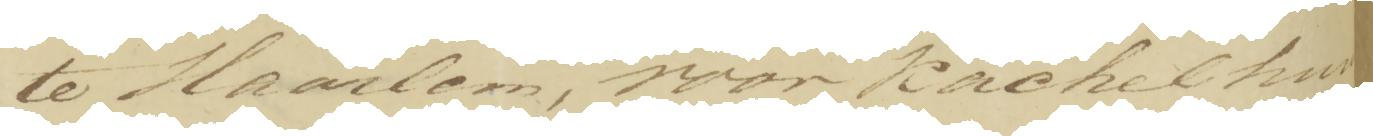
te Haarlem, voor kachel hu
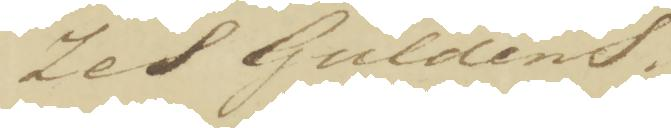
Zes Guldens.
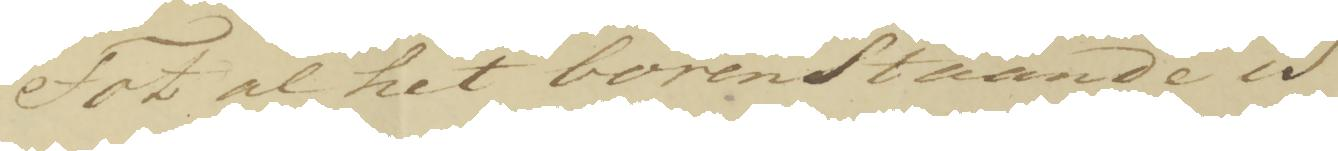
Tot al het bovenstaande is
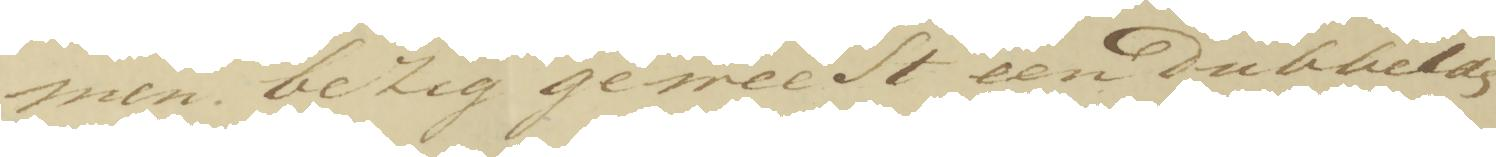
men bezig geweest een dubbelde
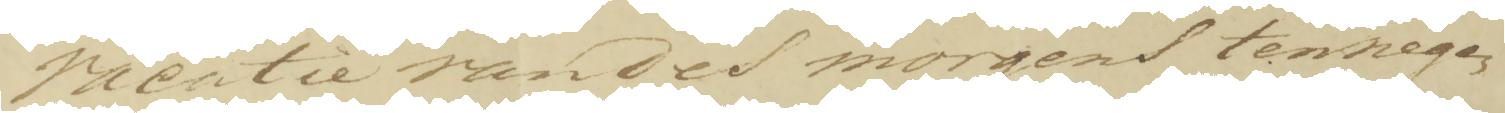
vacatie van des morgens ten negen
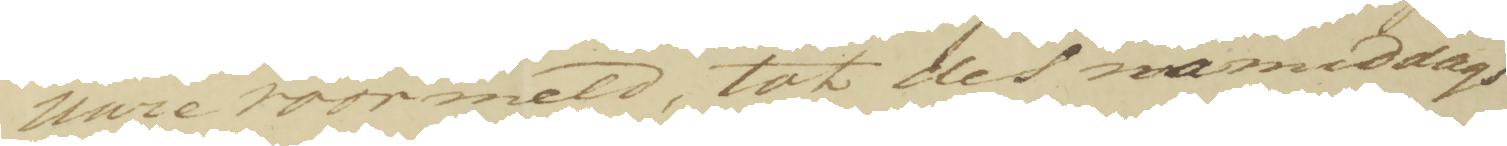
uure voormeld, tot des namiddags
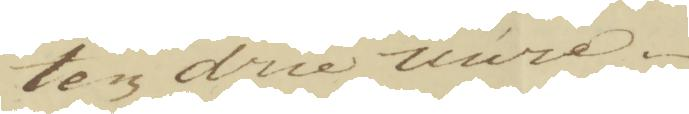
ten drie uure —
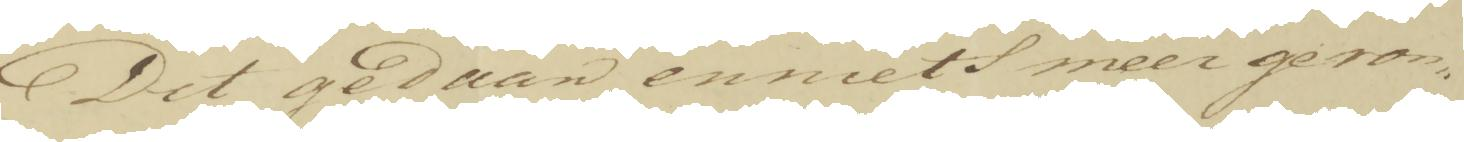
Dit gedaan en niets meer gevon„
